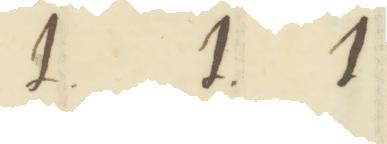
1. 1. 1
